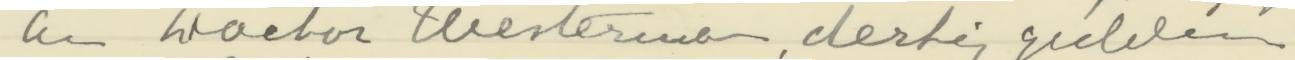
Aan Doctor Westerman, dertig gulden
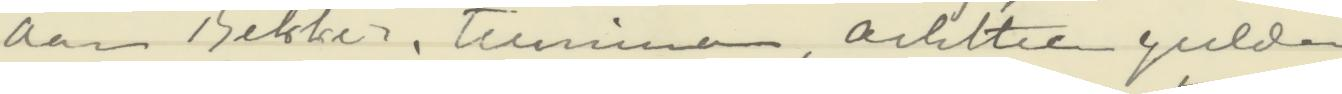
Aan Bekker, tuinman, achttien gulden
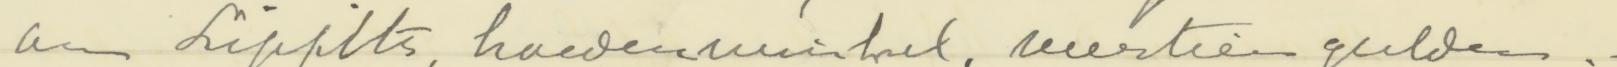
Aan Lippits, hoedenwinkel, veertien gulden.
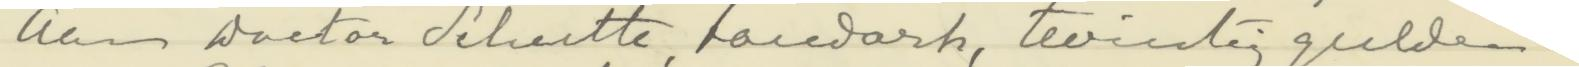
Aan doctor Schutte, tandarts, twintig gulden
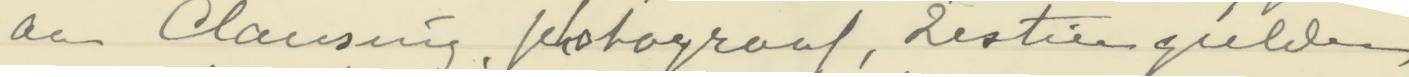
aan Clausing, photograaf, zestien gulden
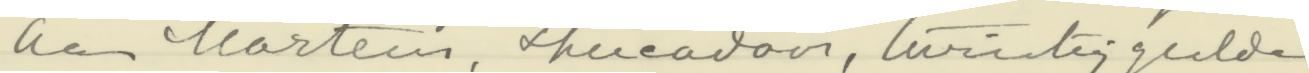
Aan Martens, stucadoor, twintig gulden
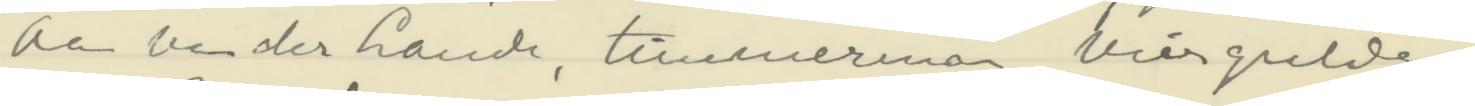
Aan van der Lande, timmerman, vier gulden
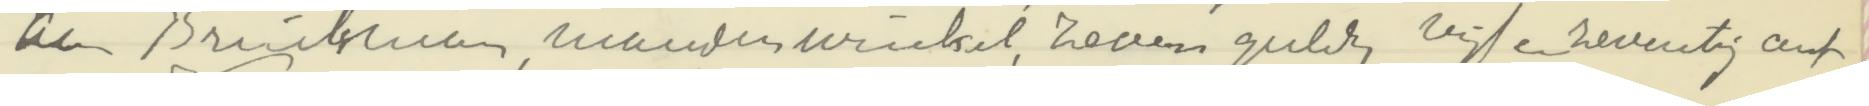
Aan Brinkman, mandenwinkel, zeven gulden, vijf en zeventig cents
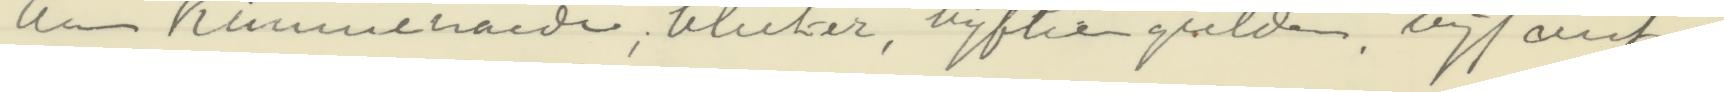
Aan Kimmenaade, bleeker, vijftien gulden, vijf cent -
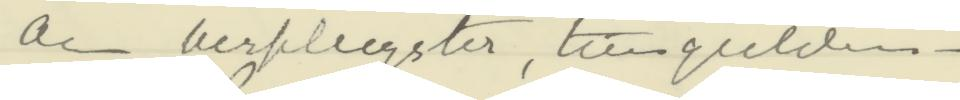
Aan verpleegster, tien gulden -
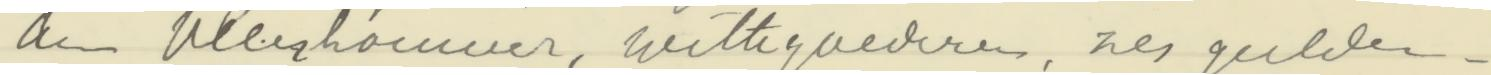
Aan Kleyhouwer, wittegoederen, zes gulden.
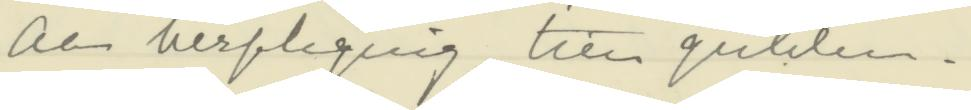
Aan verpleging tien gulden.
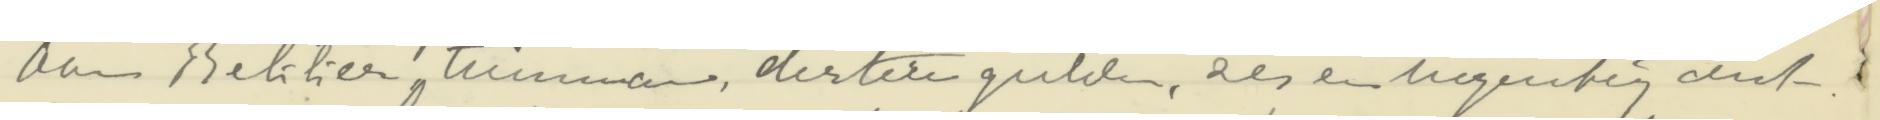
Aan Bekker, tunman, dertien gulden, zes en negentig cent.
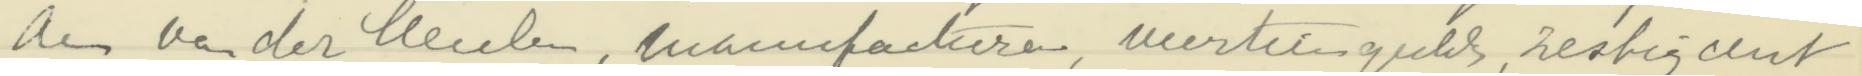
Aan van der Keulen, manufacturen, veertien gulden, zestig cent
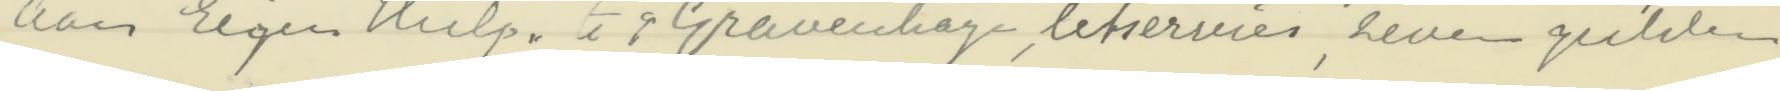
Aan Eigen Hulp„ te s Gravenhage, eetservies, zeven gulden
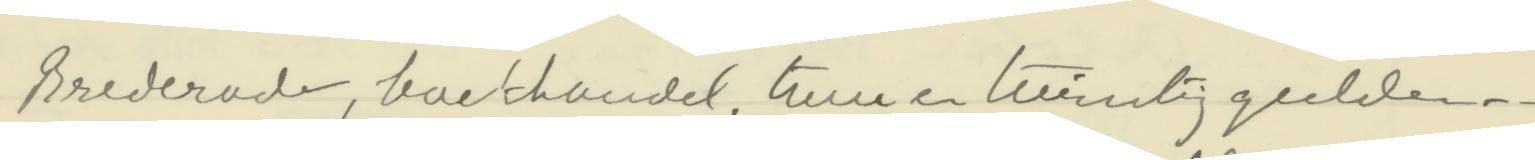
Brederode, boekhandel, twee en twintig gulden-
